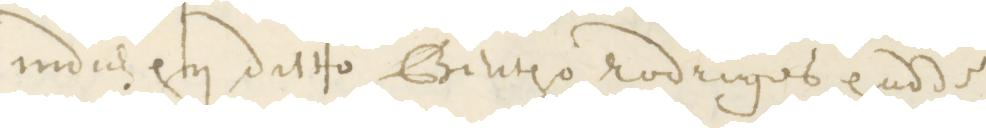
indien hy ditto Bentho rodriges hadde
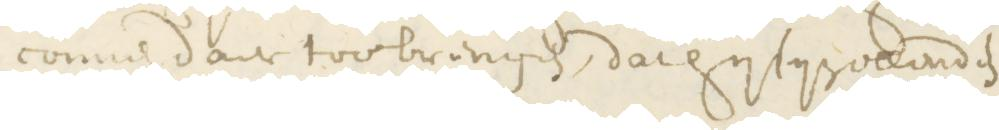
connen daer toebrengen, dat hy synellenden
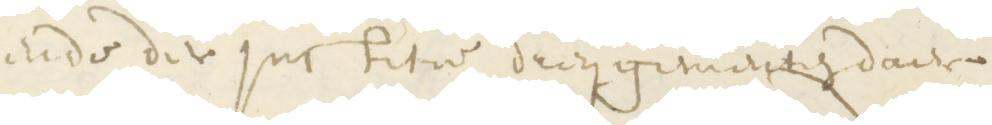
ende der justitie dreygementen daer
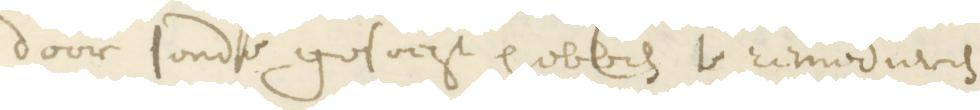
door soude gesocht hebben te remedieren
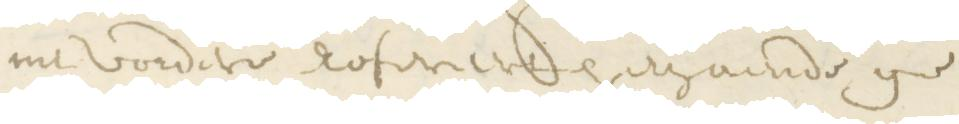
int vordere refereert hy aende ge
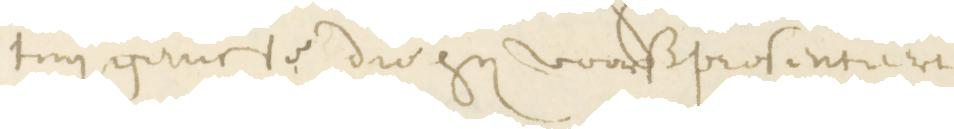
tuygenisse die hij voors presenteert
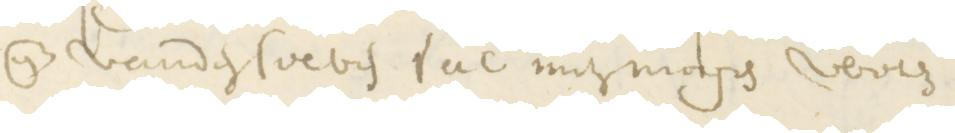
ende vandenselven sal men mogen weten
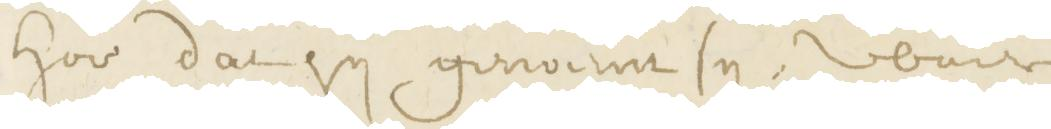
Hoe dat hy genoemt sy, waer
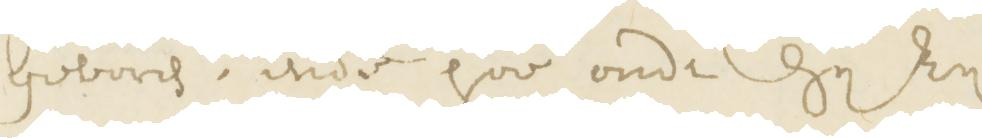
geboren, ende hoe oudt hy zy
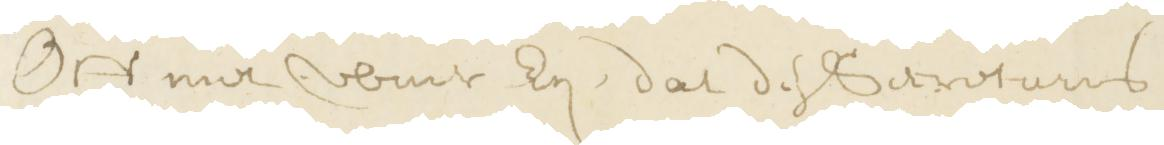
Oft niet waer zy, dat den Secretaris
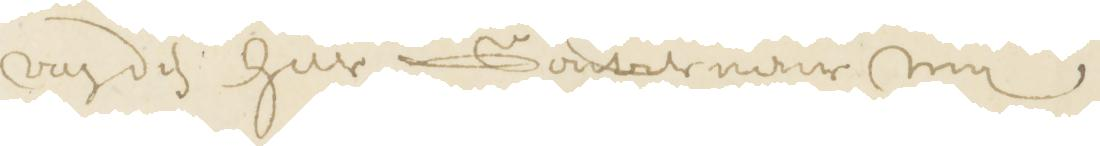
vanden heer Gouverneur my
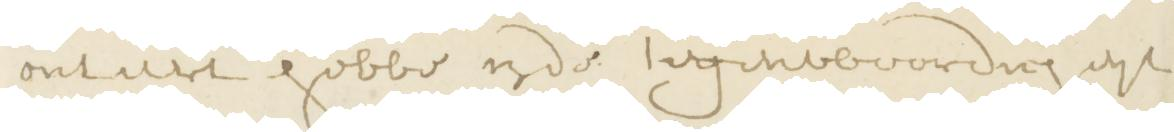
onteert hebbe inde tegenwoordicheyt
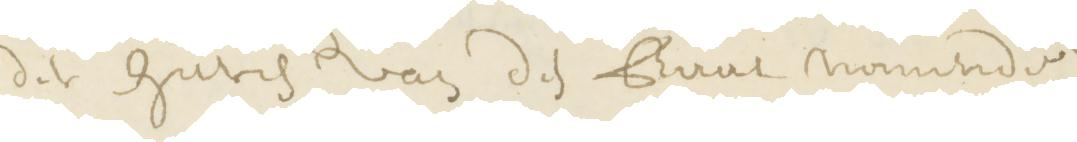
der heeren van den Raat noemende
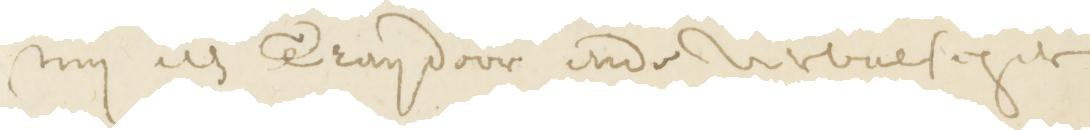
my een Treydoor ende vervalscher
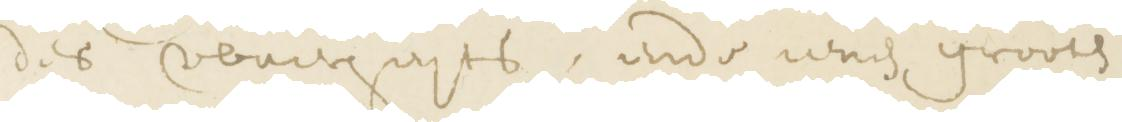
des waerheyts, ende eenen grooten
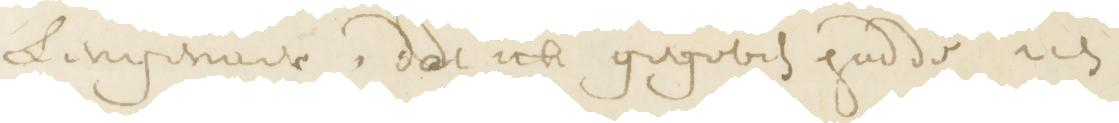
Leugenaer, dat ick gegeven hadde een
